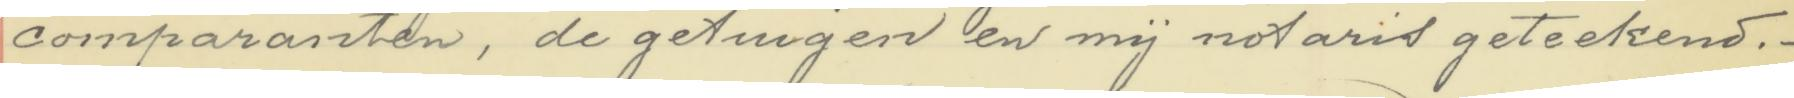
comparanten, de getuigen en mij notaris geteekend.
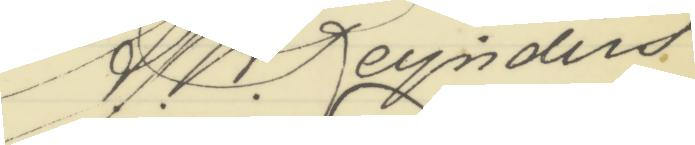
A.J.H.Reijnders
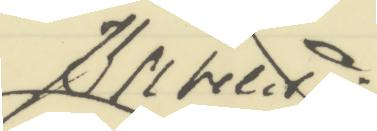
JSabelis
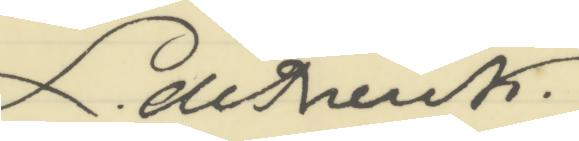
L.deBreuk.
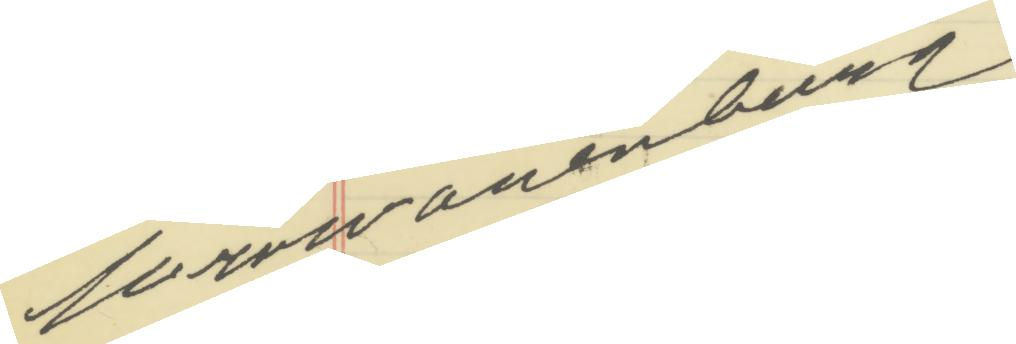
Wcvwayenburg
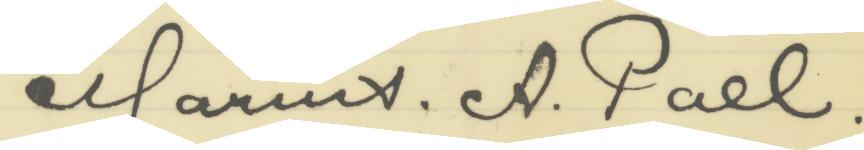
Marius. A. Poel
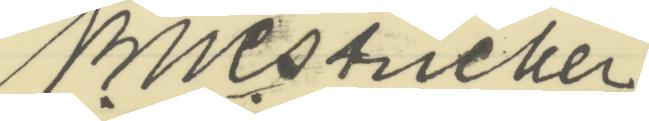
B.H.C.Stricker
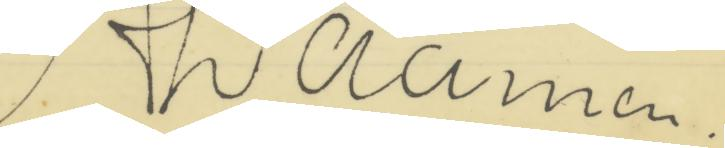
ADaamen.
